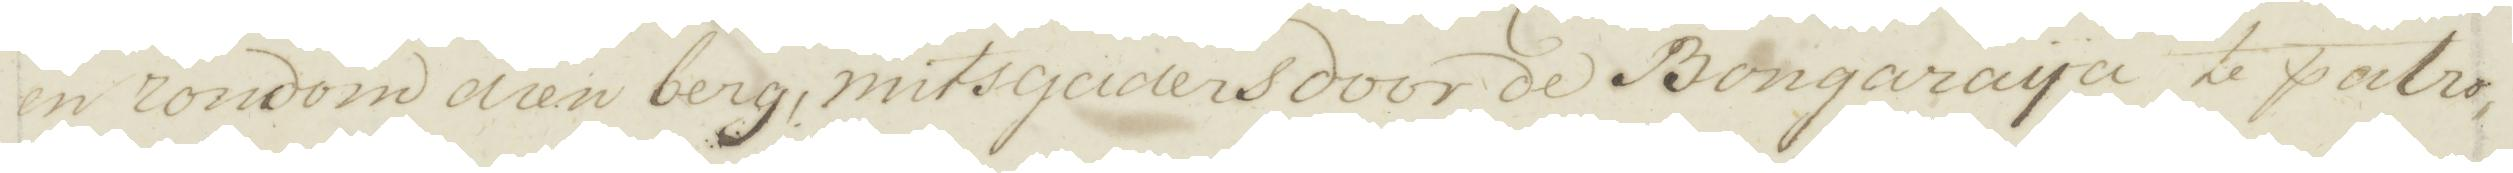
en rondom dien berg, mitsgaders door de Bongaraija te patro„
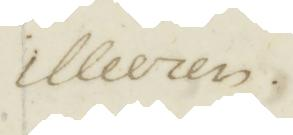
illeeren.
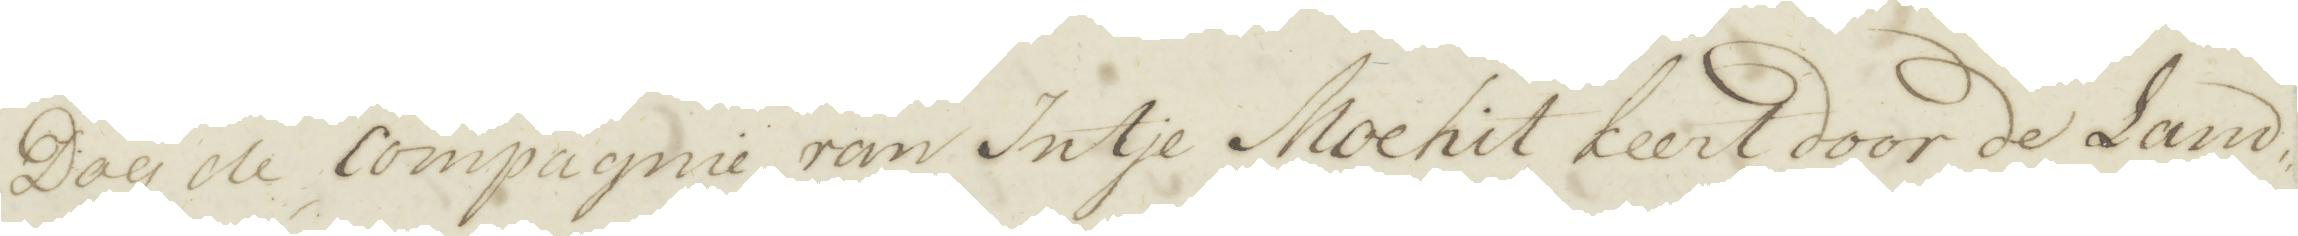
Dog de compagnie van Intje Moehit keert door de Land„
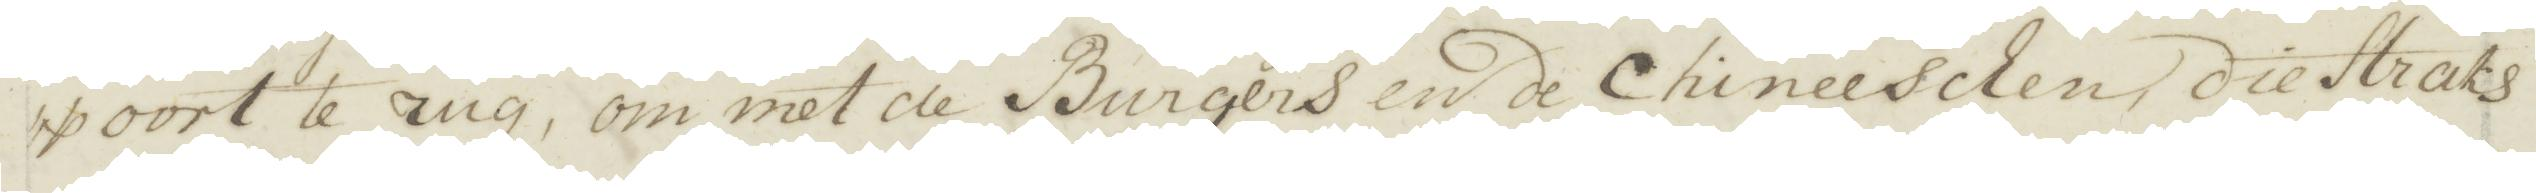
„poort te rug, om met de Burgers en de Chineeschen, die Straks
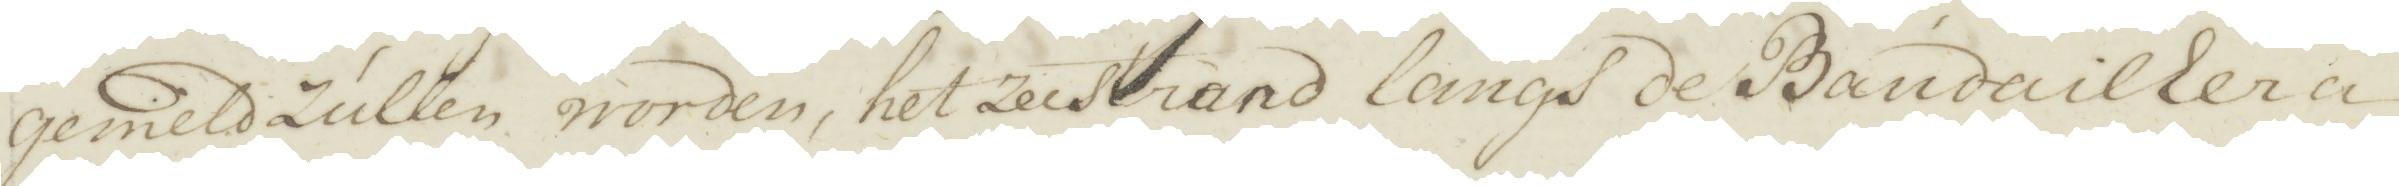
gemeld zullen worden, het zeestrand langs de Bandail hera
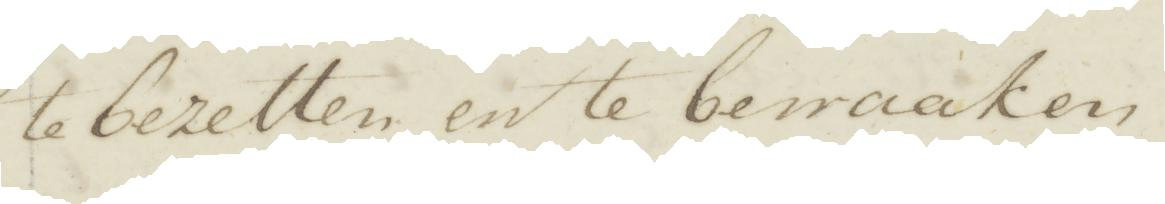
te bezetten en te bewaaken
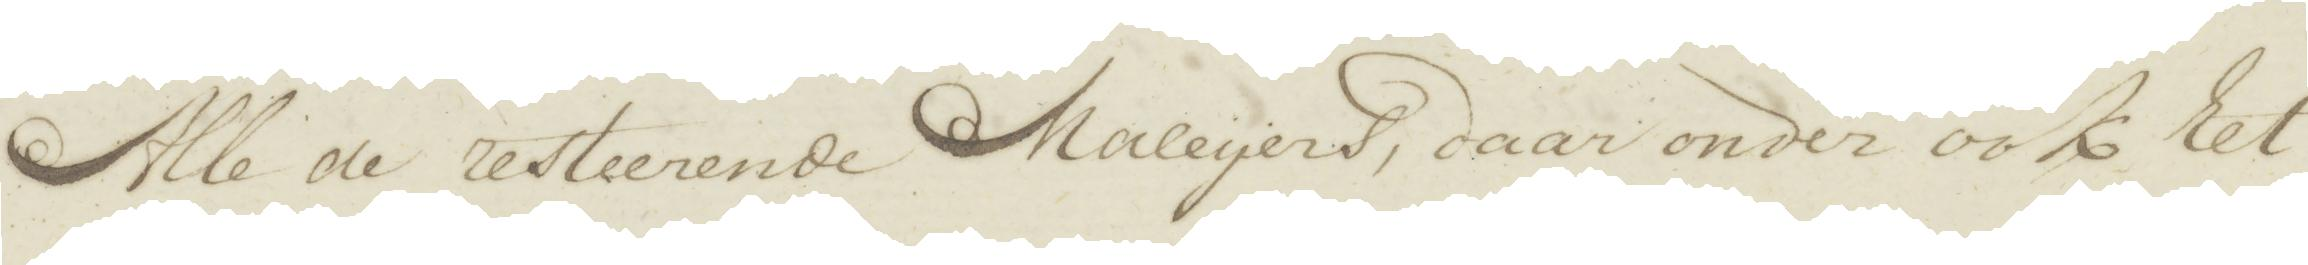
Alle de resteerende Maleijers, daar onder ook het
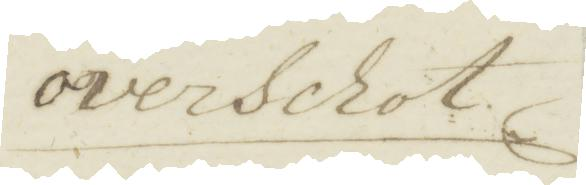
overschot.
